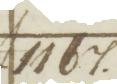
ƒ1167.
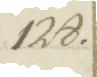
128.
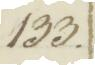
133.
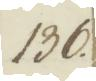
136.
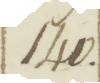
140.
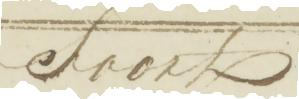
soort
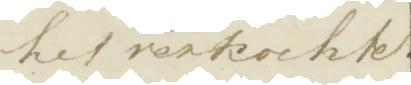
het verkochte
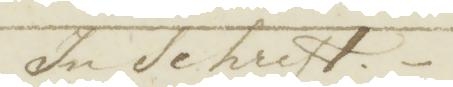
In Schrift.
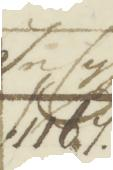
ƒ1167
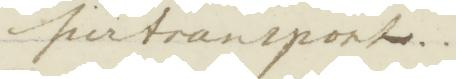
per transport.
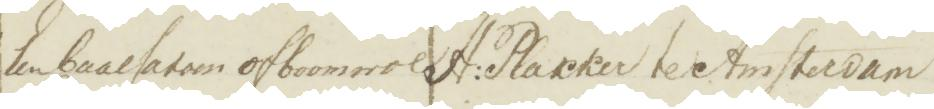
Een baal catoen of boomwol A: Hacker te Amsterdam
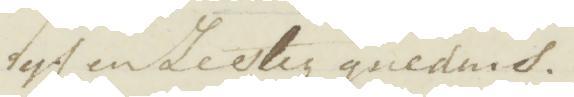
Vyf en Zestig guldens.
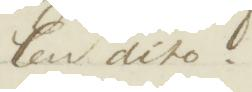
Een dito .
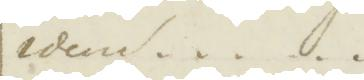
idem . . . . . .
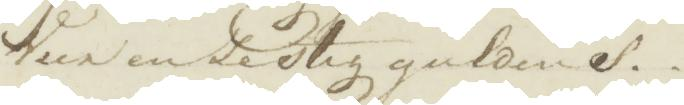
Vier en Zestig guldens. .
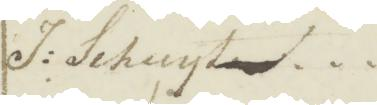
J: Schuyte. . .
